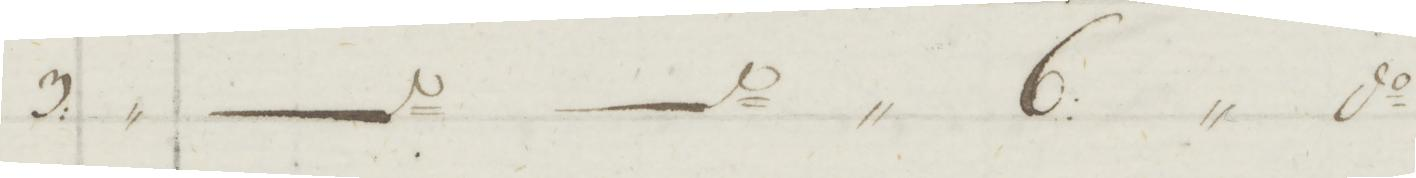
3: „ _=o _=o „ 6: „ d=o
